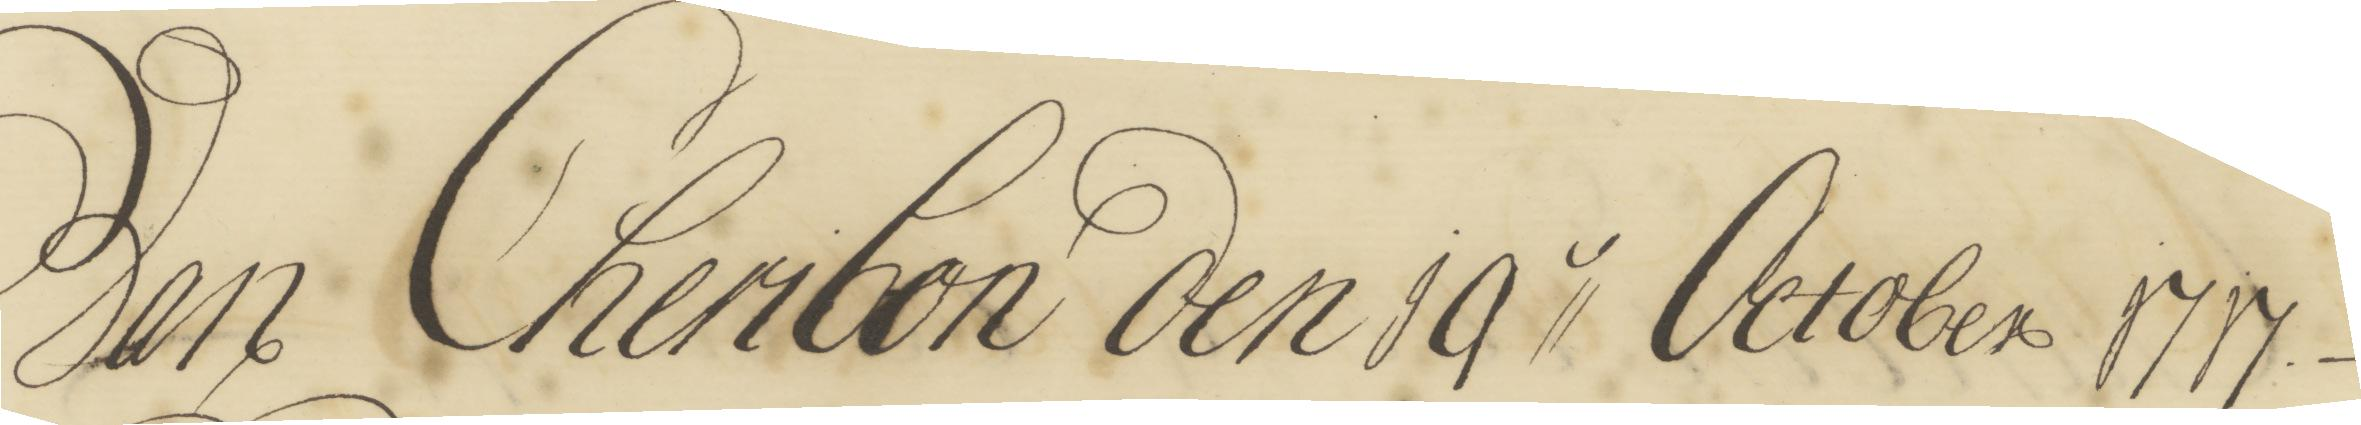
Van Cheribon den 19„e October 1717
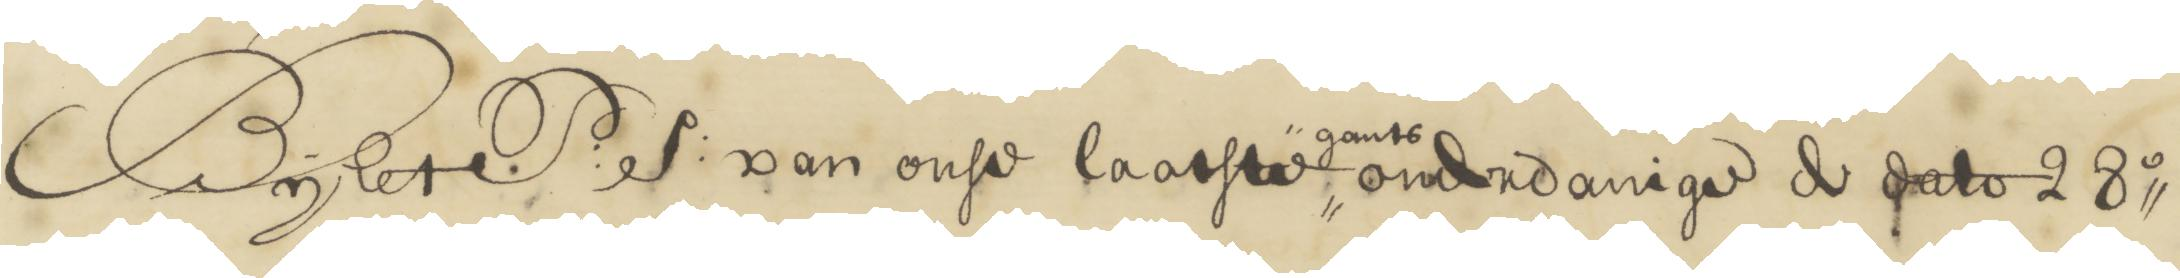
Bij het P: S: van onse laatste „ „ gants onderdanige de dato 28„e
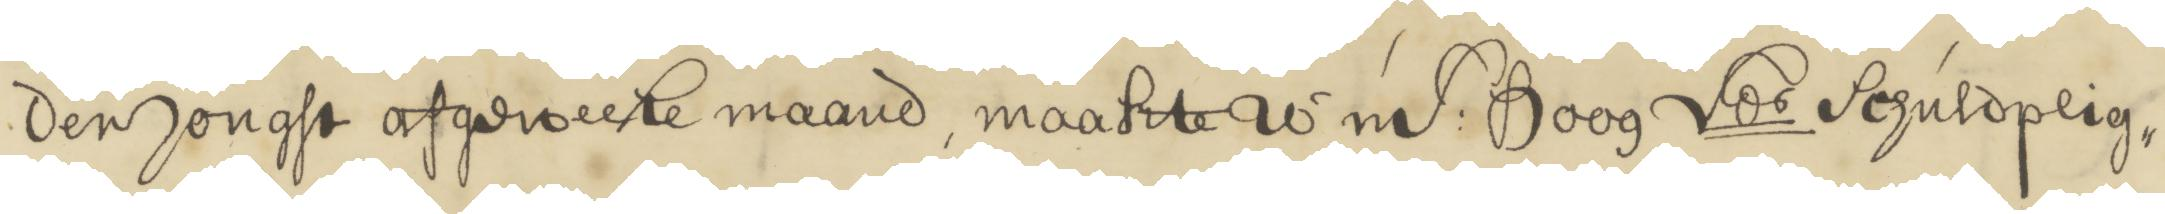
den jongst afgeweeke maand, maakte w' uE: Hoog Ed=s schuldplig
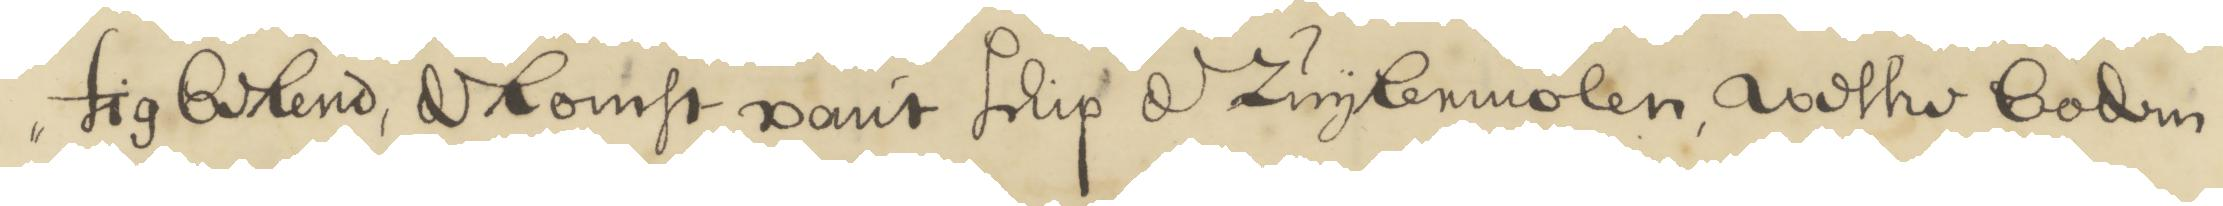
„tig bekend, de komst van’t schip de Zuijkermolen, welke bodem
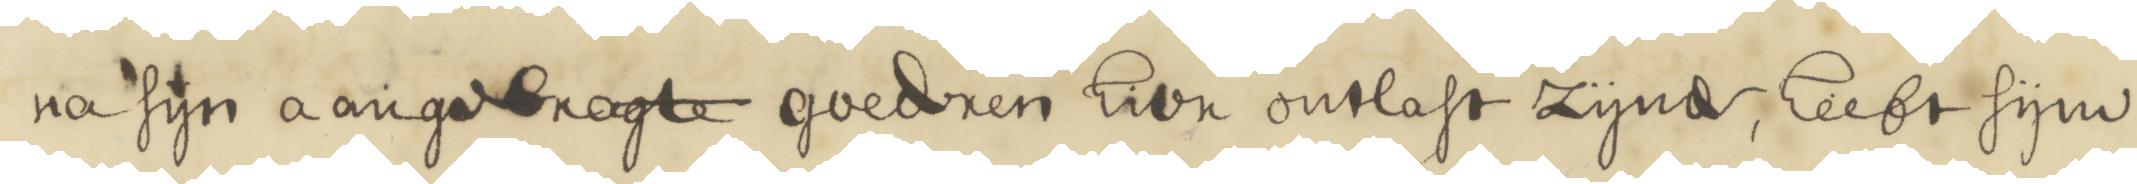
na sijn aangebragte goederen hier ontlast zijnde, heeft sijne
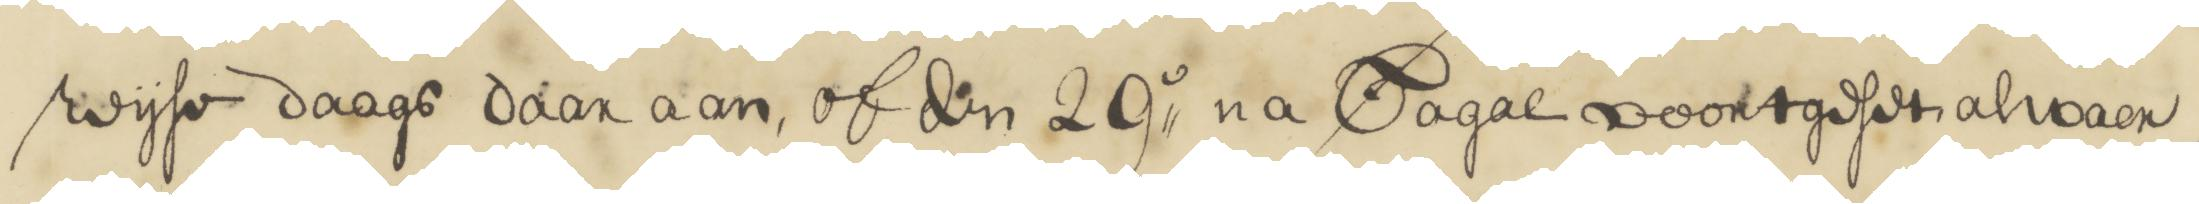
reijse daags daar aan, of den 29„e na Pagal voortgeset alwaer
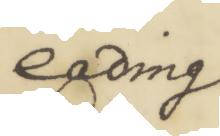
lading
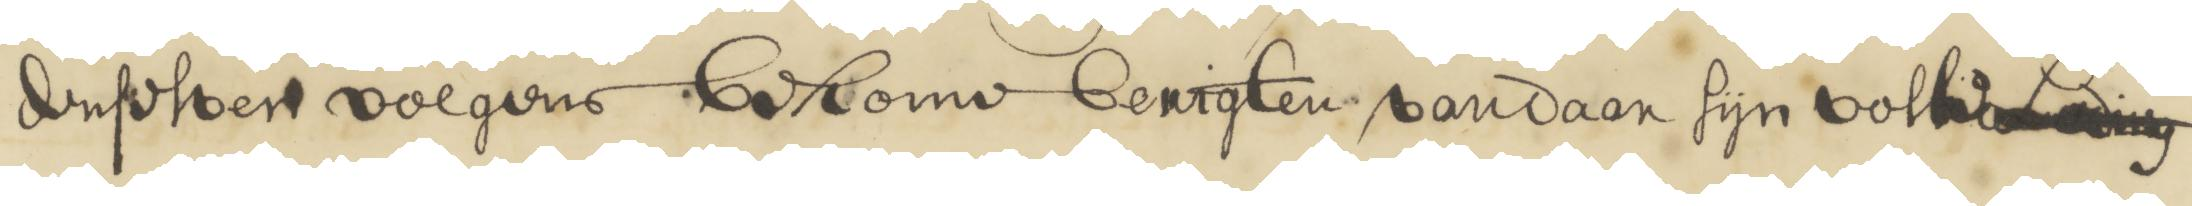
denselven volgens bekome berigten vandaar sijn volle
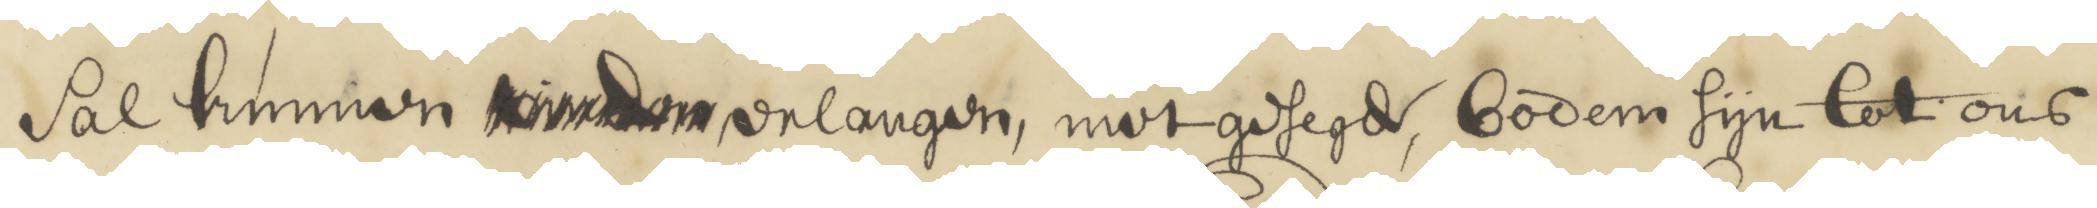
sal kunnen erlangen, met gesegde, bodem sijn tot ons
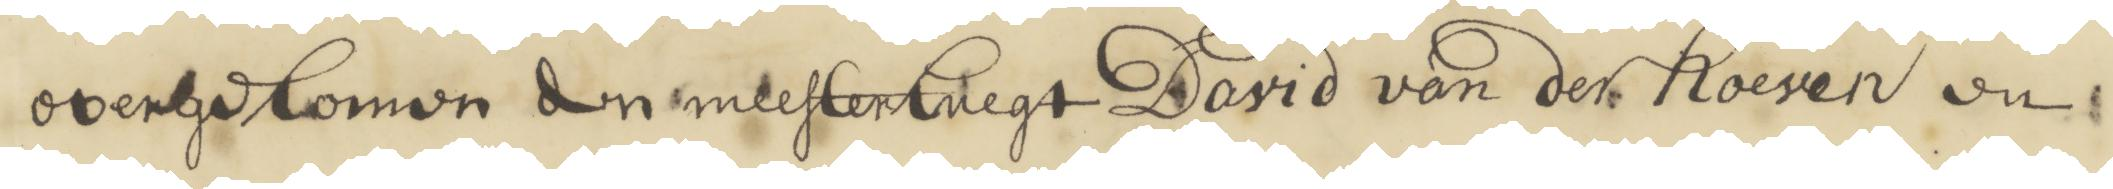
overgekomen den meesterknegt David van der Hoeven en
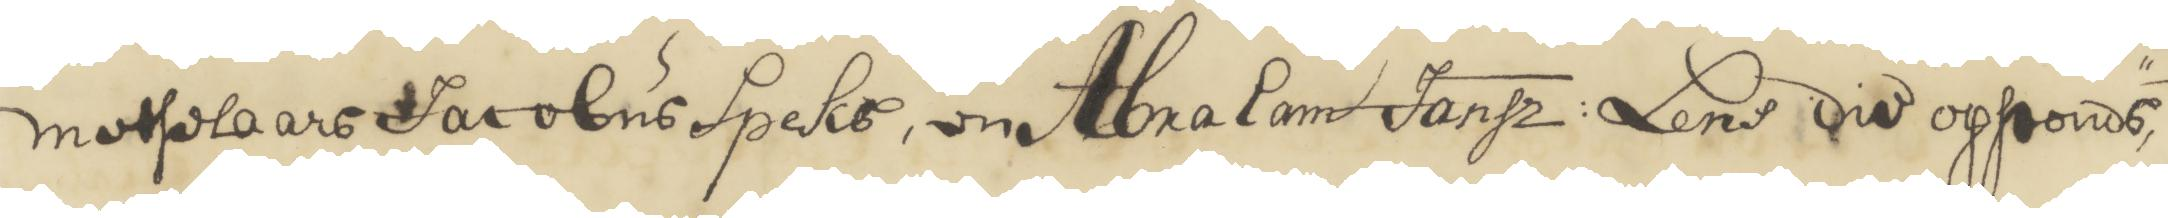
metselaars Jacobus speks, en Abraham Jansz: Lens die opstonds,
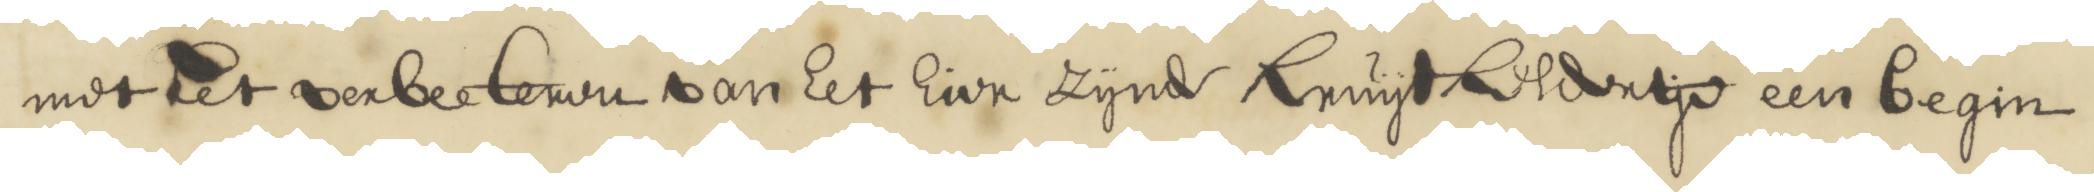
met het verbeeteren van het hier zijnde kruijtkeldertje een begin
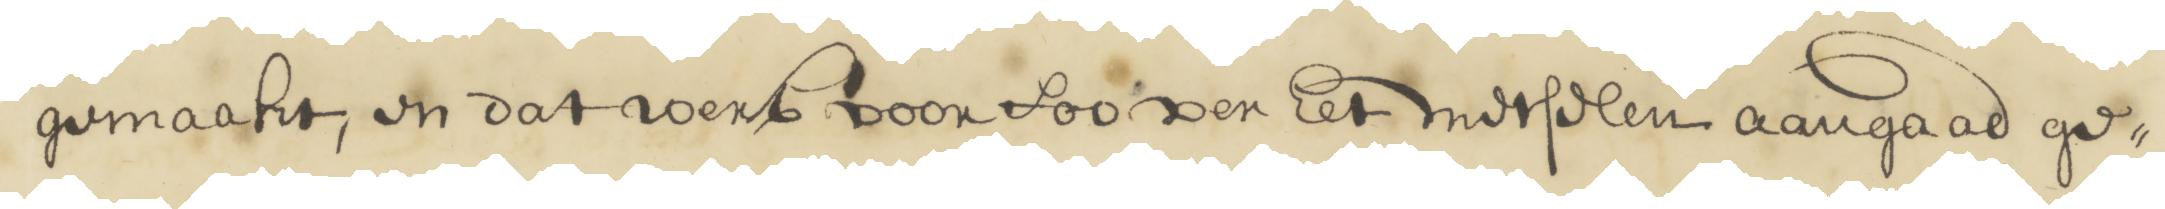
gemaakt, en dat werk voor soo ver het metselen aangaad ge„
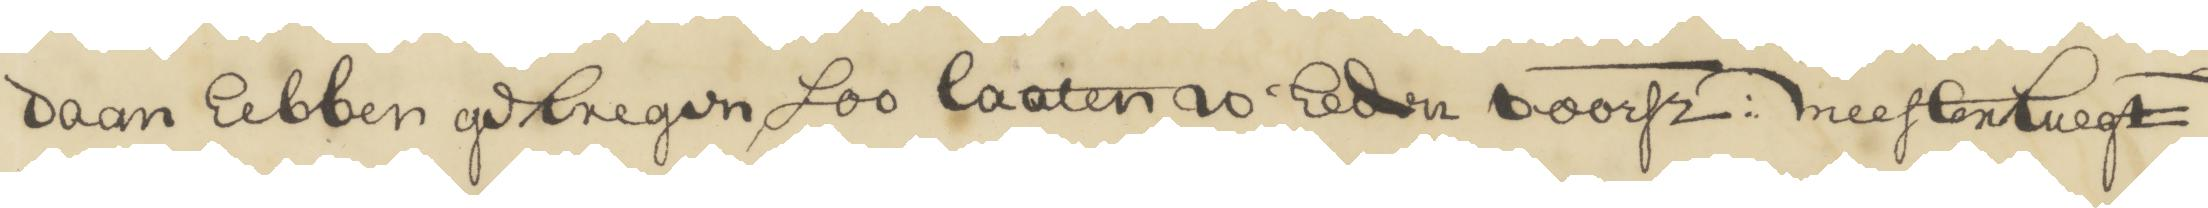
daan hebben gekregen, soo laaten w' heden voorsz: meesterknegt
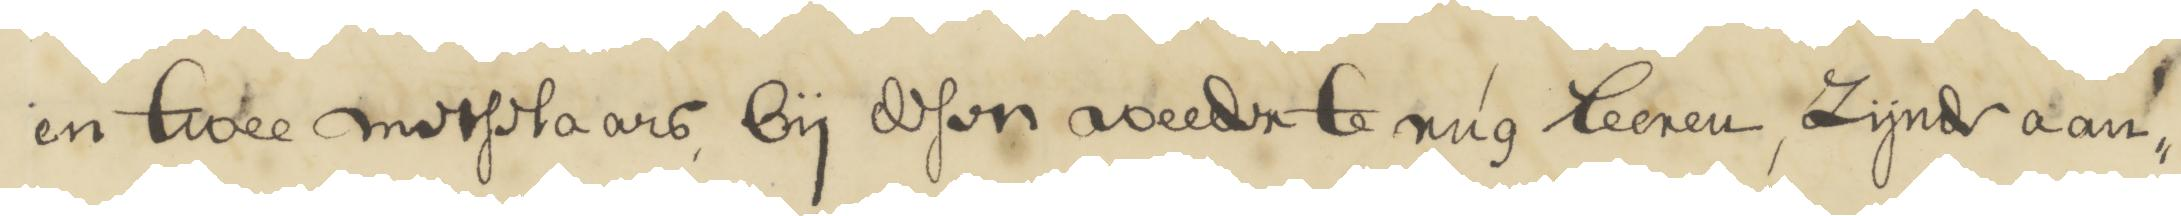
en twee metselaars bij desen weeder te rug keeren, zijnde aan„
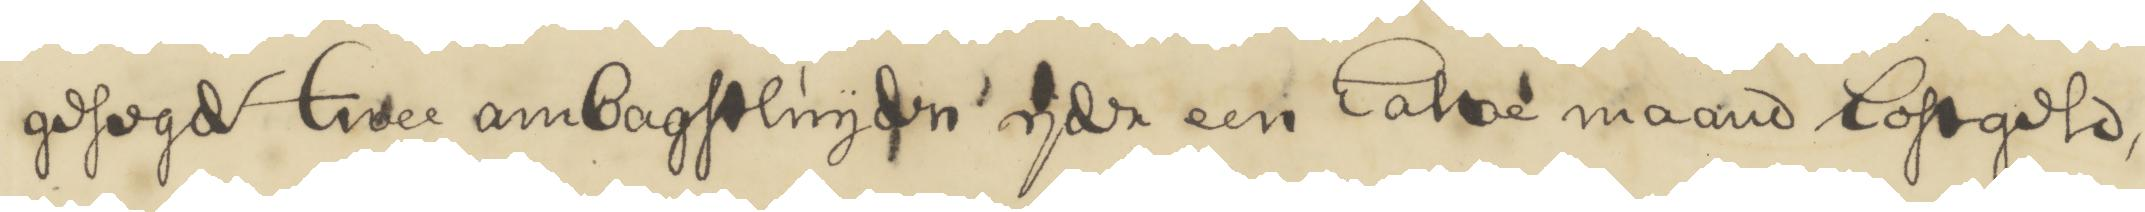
gesegde twee ambagstluijden ijder een halve maand kostgeld
